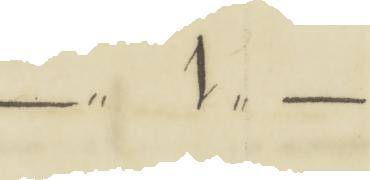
—„ 1„ —
